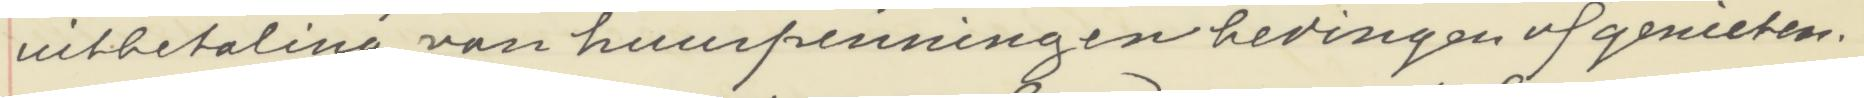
uitbetaling van huurpenningen bedingen of genieten.
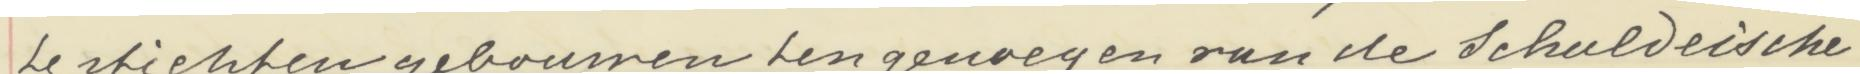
te stichten gebouwen ten genoegen van de schuldeische
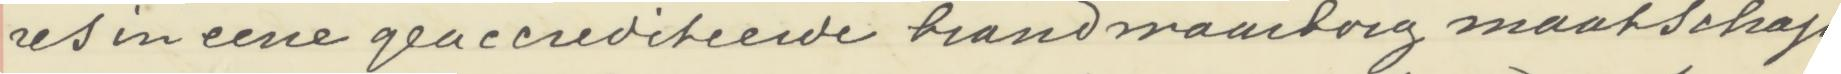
res in eene geaccrediteerde brand waarborg maatschap
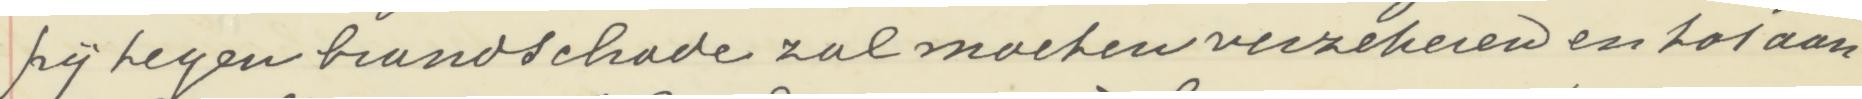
pij tegen brandschade zal moeten verzekeren en tot aan
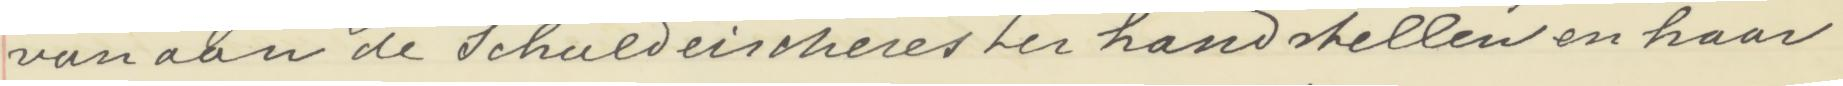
van aan de schuldeischeres ter hand stellen en haar
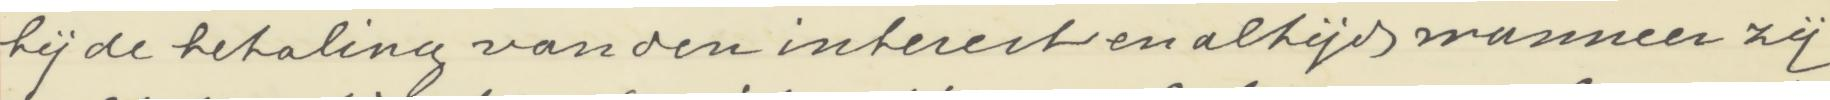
bij de betaling van den interest en altijd wanneer zij
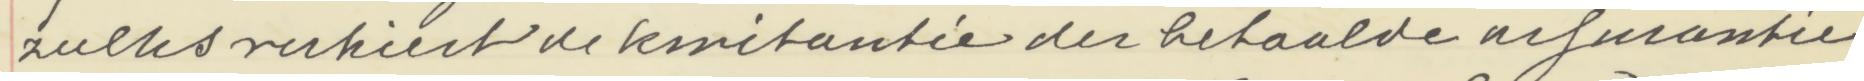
zulks verkiest de kwitantie der betaalde assurantie
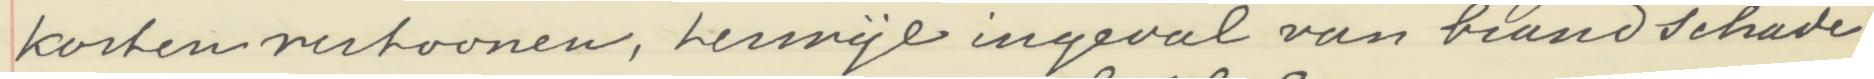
kosten vertoonen, terwijl ingeval van brandschade
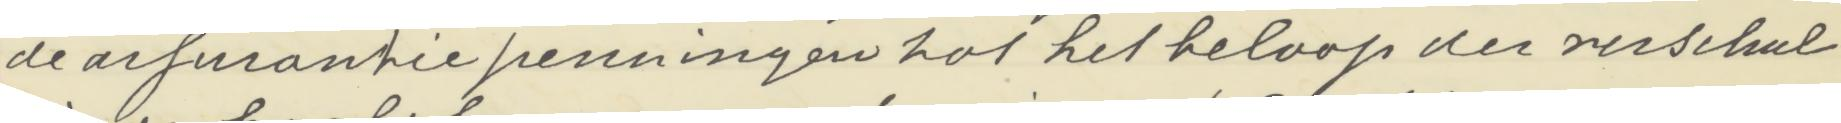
de assurantie penningen tot het beloop der verschul
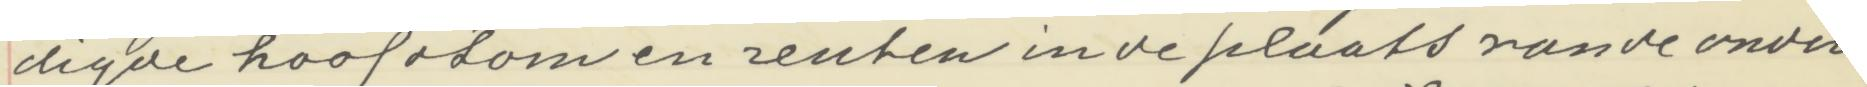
digde hoofdsom en renten in de plaats van de onder
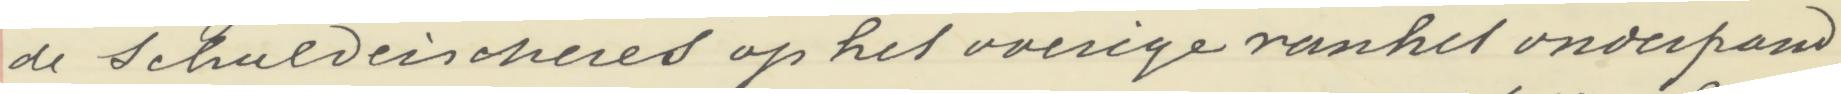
de schuldeischeres op het overige van het onderpand
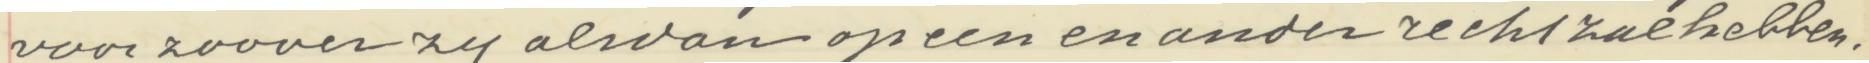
voor zoover zy alsvan op een en ander recht zal hebben,
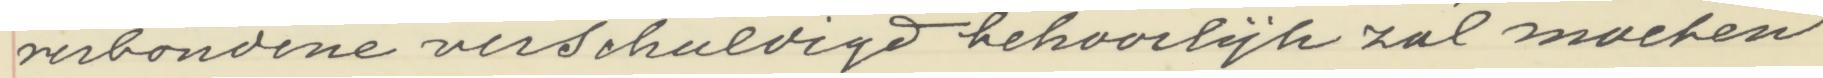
verbondene verschuldigd behoorlijk zal moeten
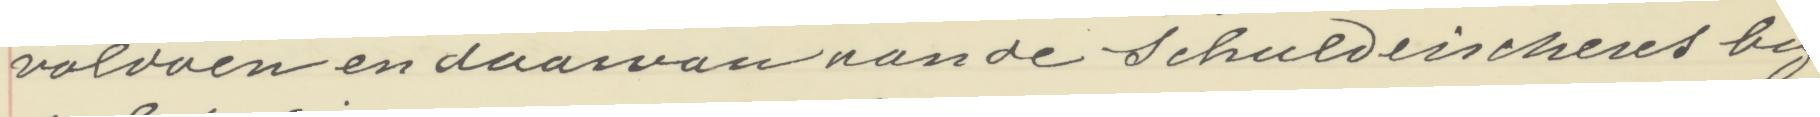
voldoen en daarvan aan de schuldeischeres bij
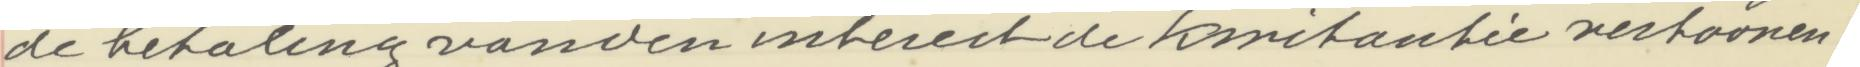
de betaling van den interest de kwitantie vertoonen.
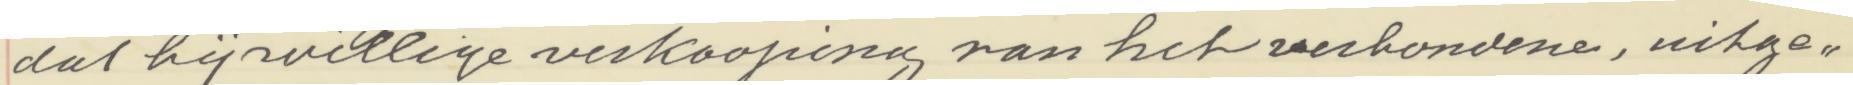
dat bij willige verkooping van het verbondene, uitge„
